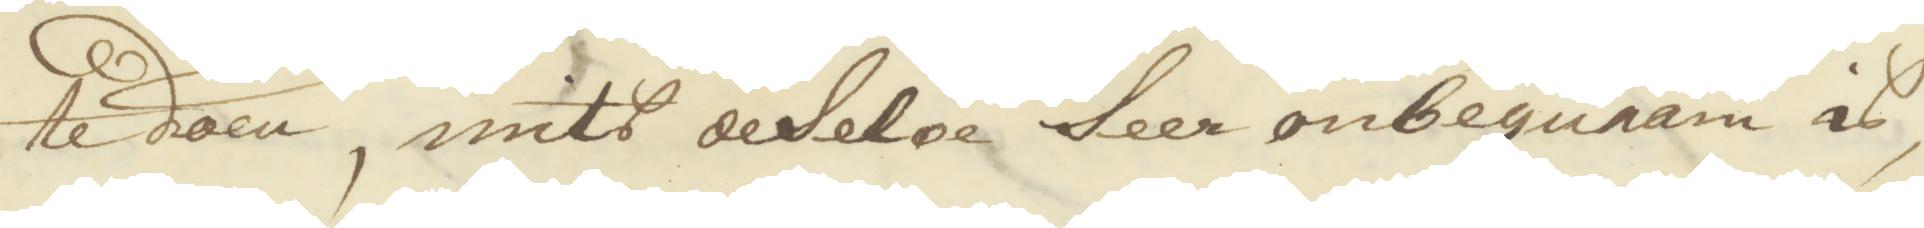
te doen, mits deselve seer onbequaam is
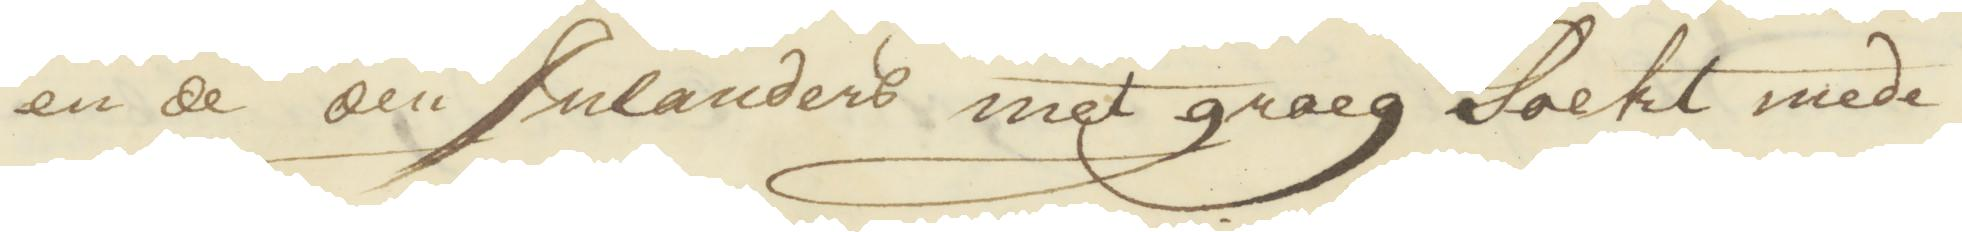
en de den Jnlanders met graeg soekt mede
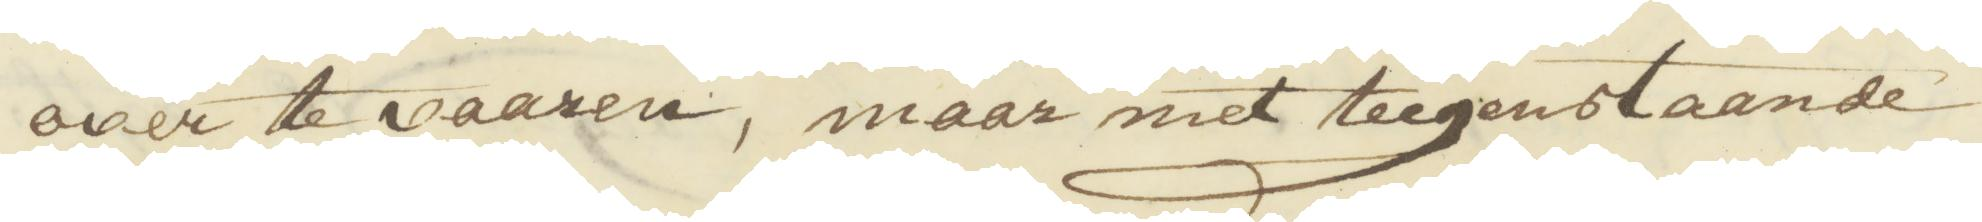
over te vaaren, maar niet teegenstaande
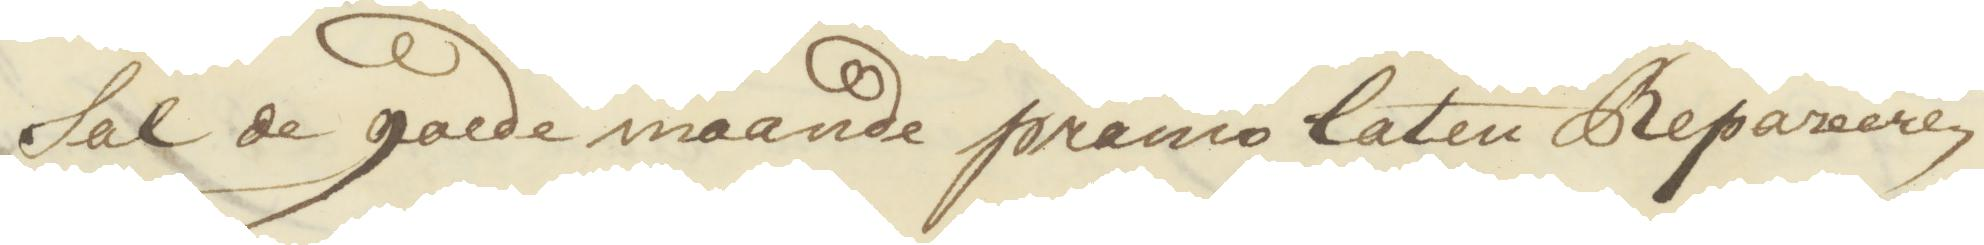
sal de goede maande prauw laten Repareeren
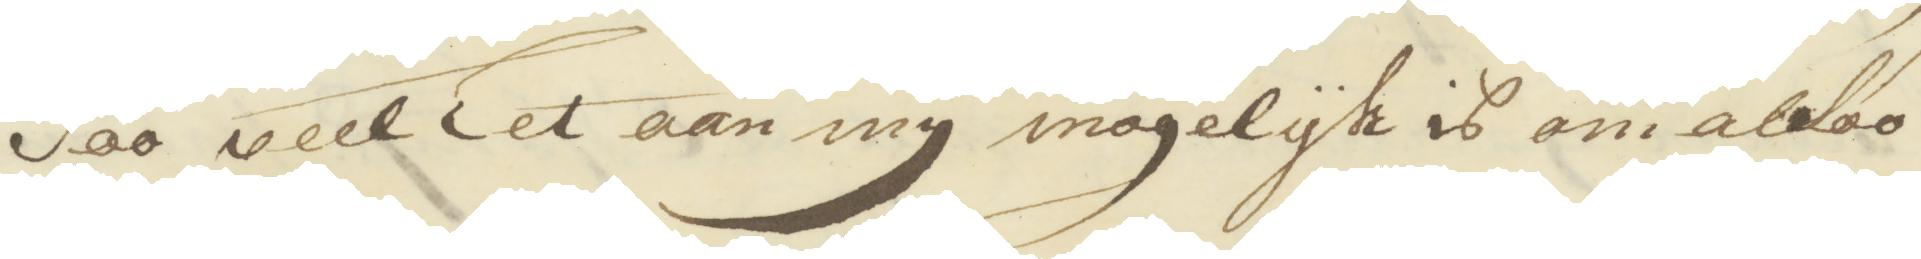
soo veel het aan mij mogelijk is om alsoo
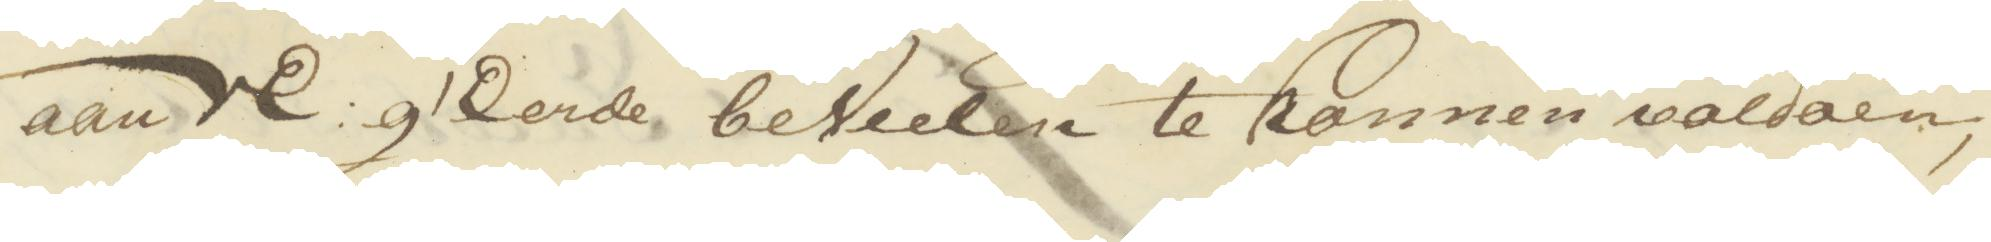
aan VE: g’Eerde beveelen te konnen voldoen,
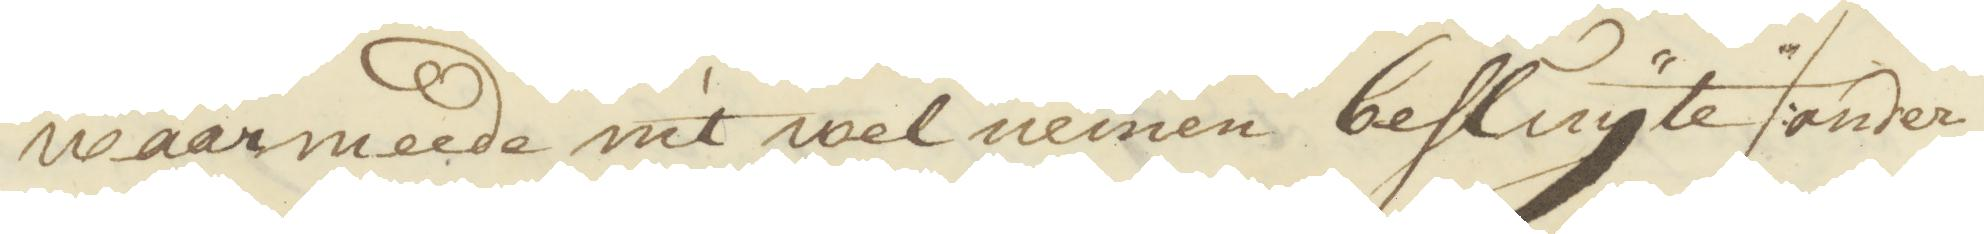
waarmeede in't wel nemen besluijte /:onder
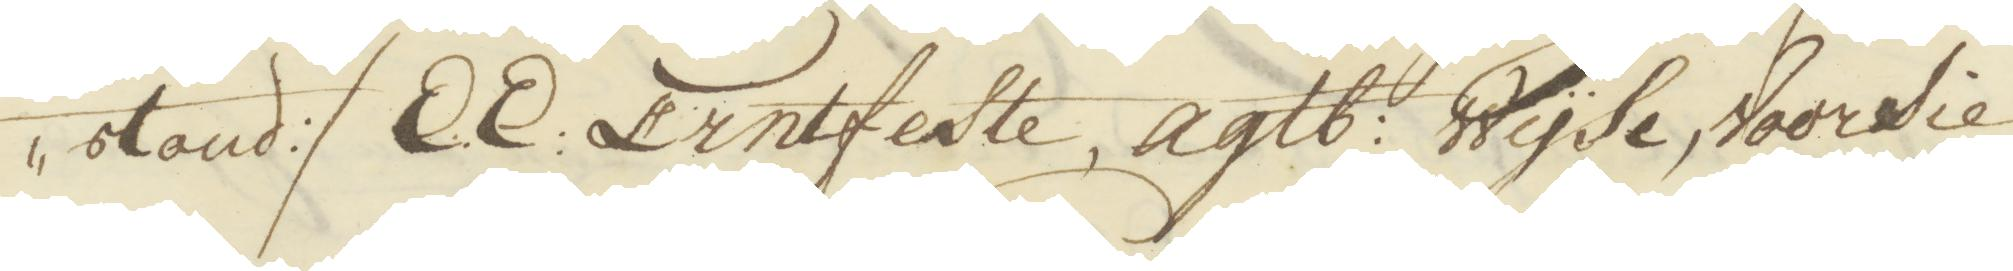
„stond:/ E:E: Erntfeste, agtb: Wijse, voorsie
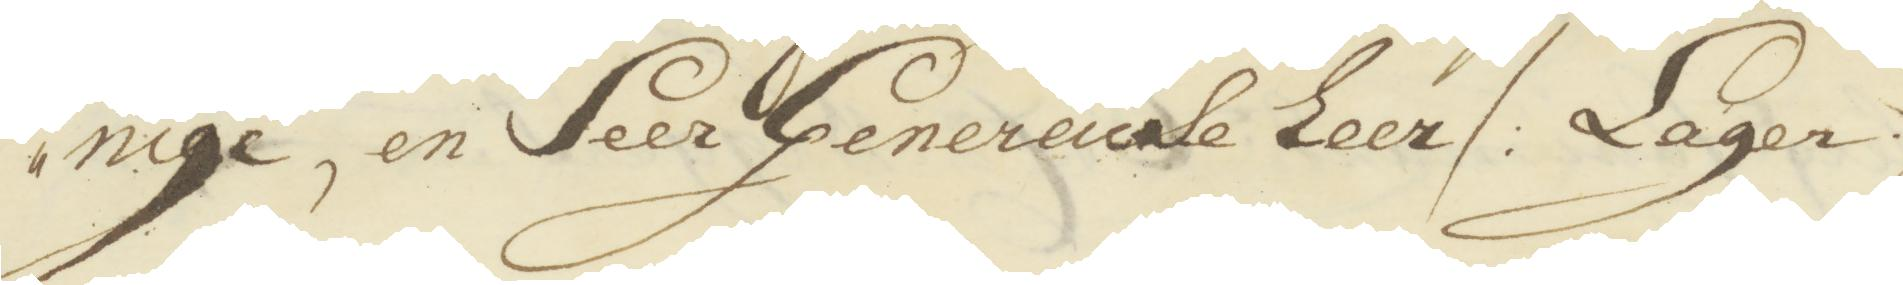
„nige, en Seer Genereurse heer /: Lager
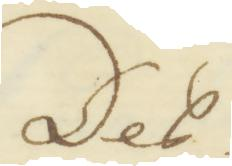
Des
